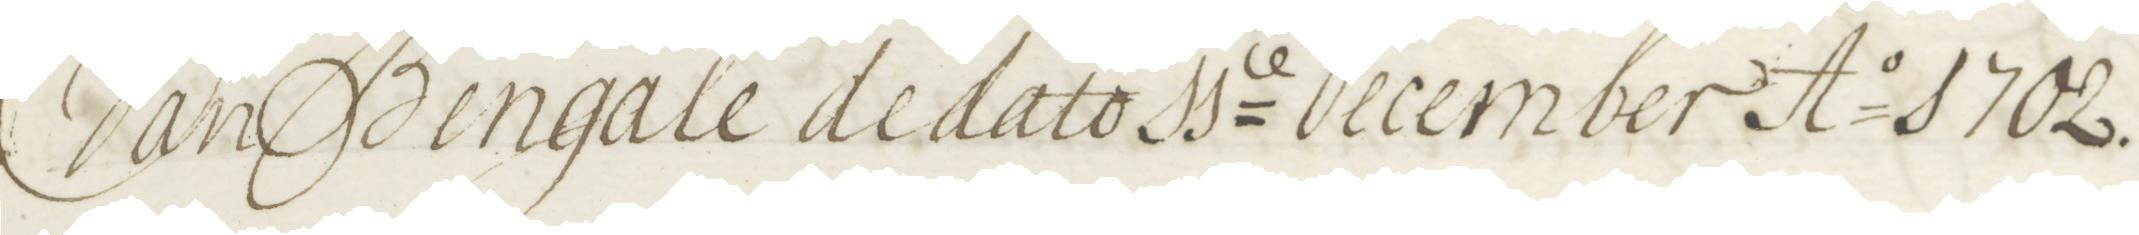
Van Bengale de dato 11=e december A=o 1702.
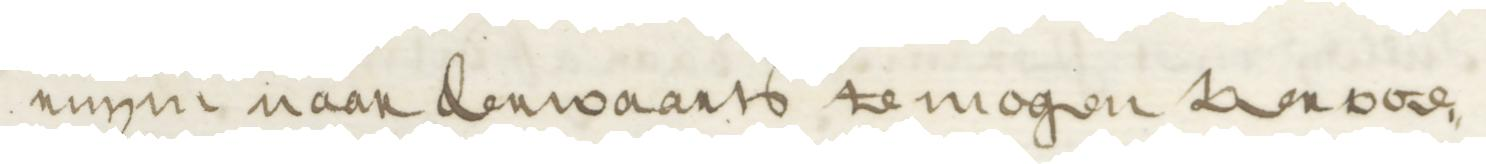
ruijm naar derwaarts te mogen vervoe„
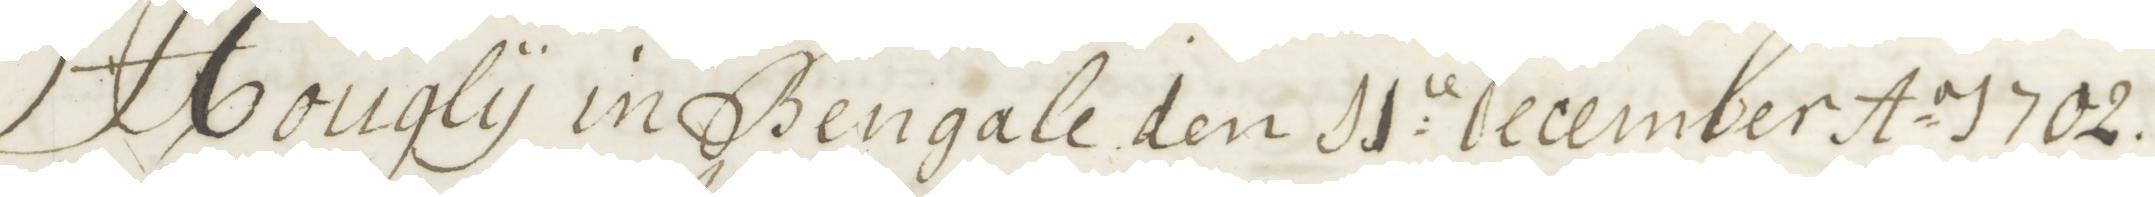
Houglij in Bengale den 11:e december A„o 1702.
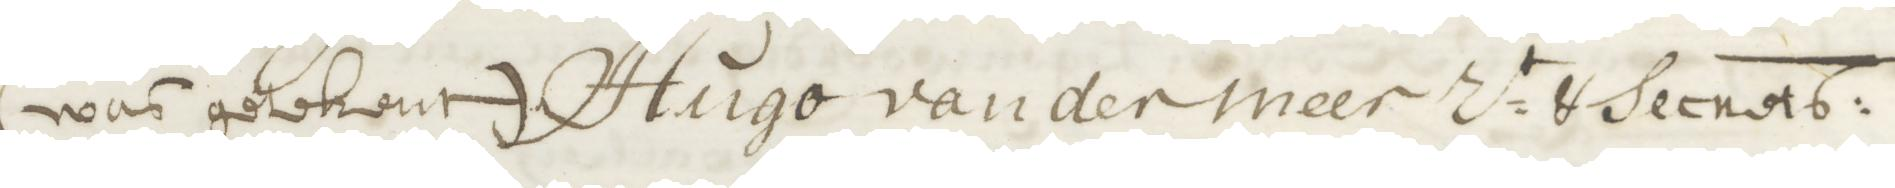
(was getekent) Hugo van der meer r=t & secrets:
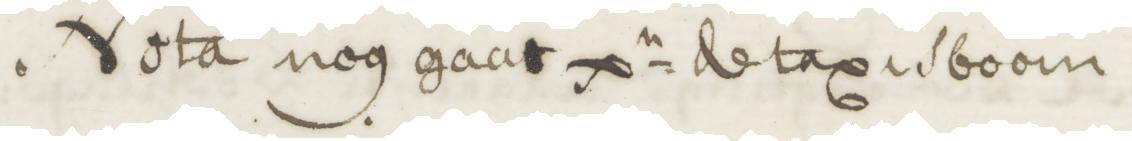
Nota nog gaat p=r de taxisboom
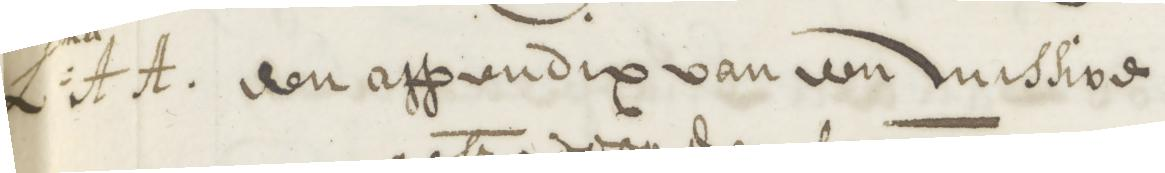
L=na A A. een appendix van een missive
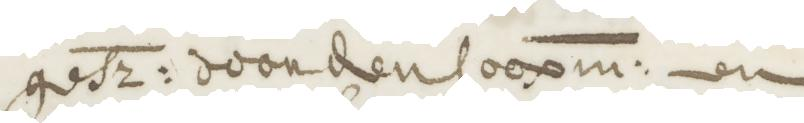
gesz: door den Coopm: en
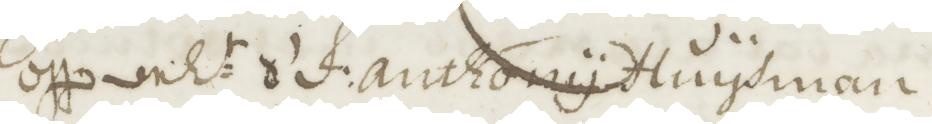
opperh:t d’ E: anthonij Huijsman
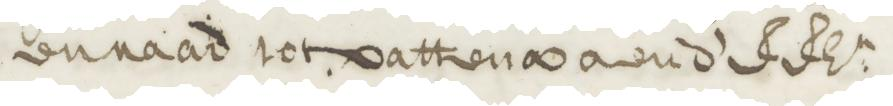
en raad tot pattena aen d’ EEh:n
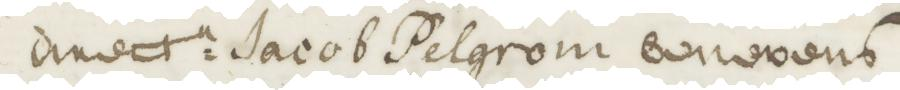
direct:r Jacob Pelgrom benevens
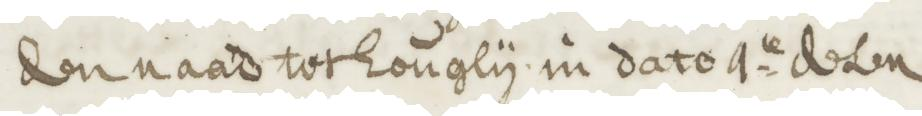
den raad tot houglij in dato 4=e deser
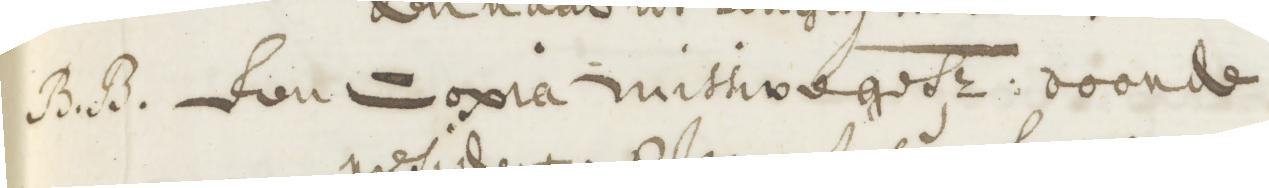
B. B. Een Copia missive gesz: door de
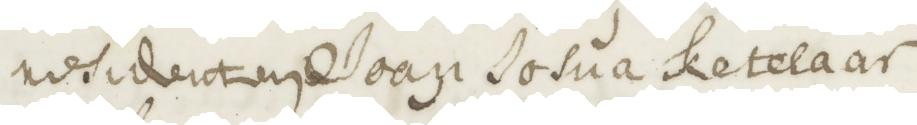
residenten Joan Josua ketelaar
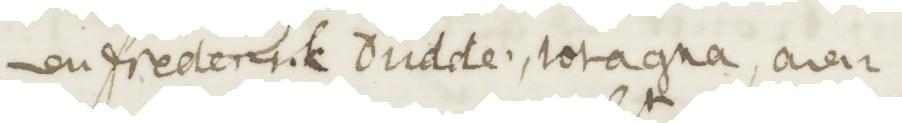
en frederick dudde, totagra, aen
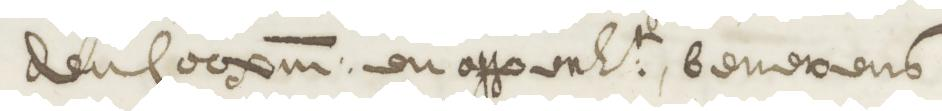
den Coopm: en opperh:t, benevens
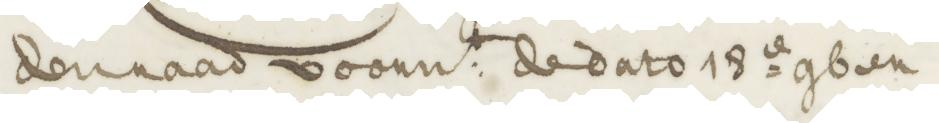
den raad voorn:t de dato 18=e 9ber
